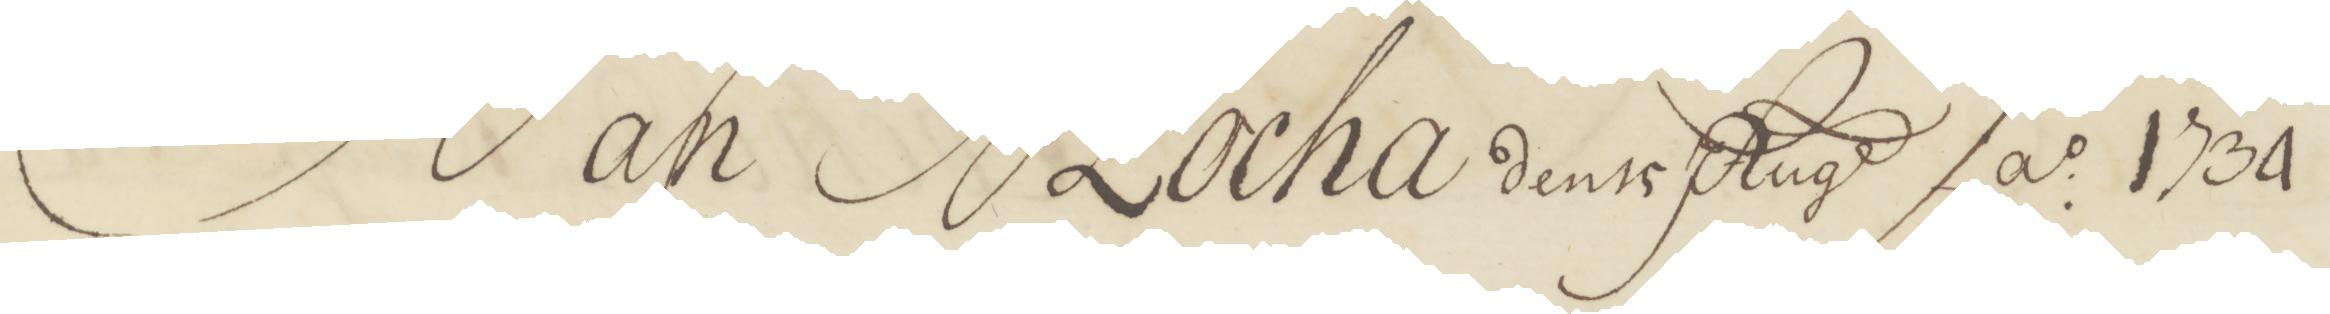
Van Mocha den 15 Aug a:o 1734
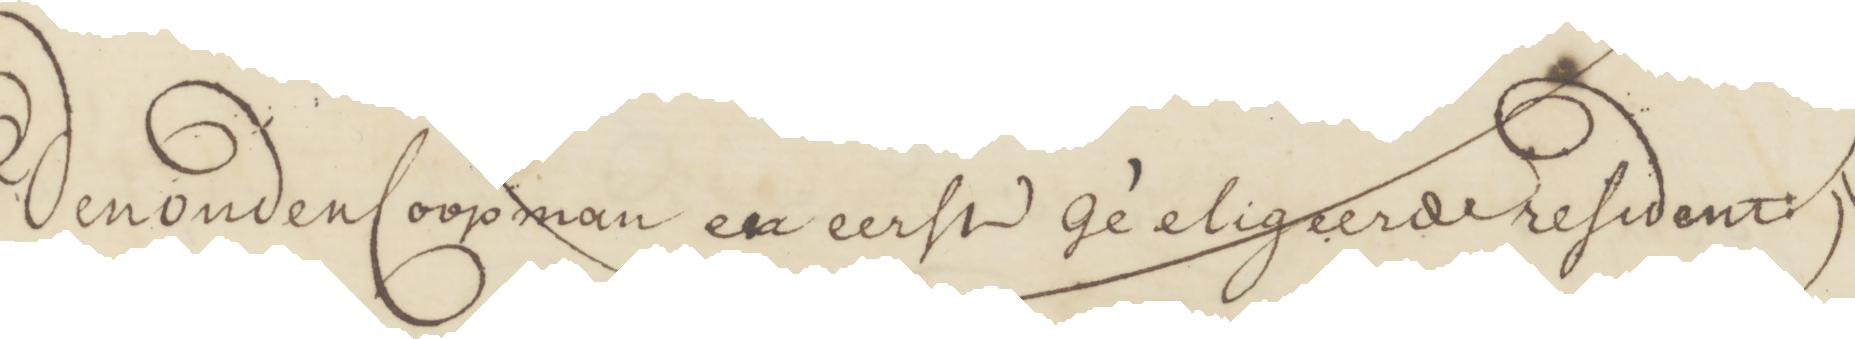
den ondercoopman en eerste ge'eligeerde resident:
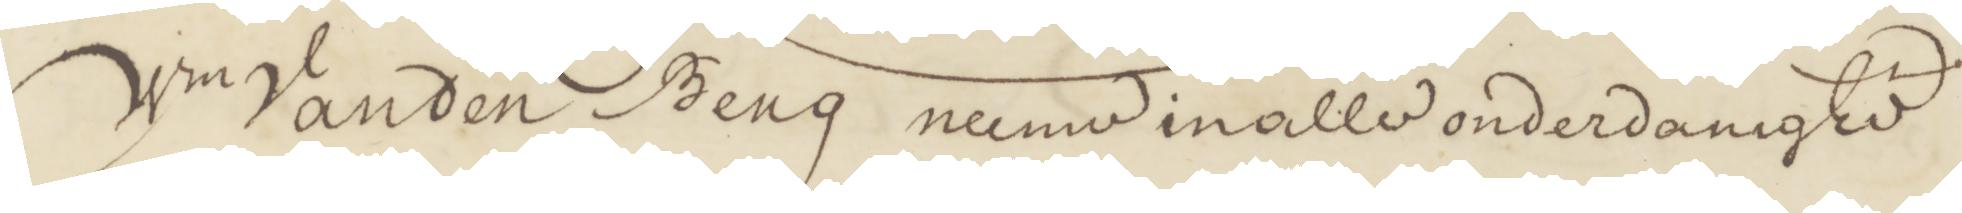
Wm Vanden Berg neeme in alle onderdanighe
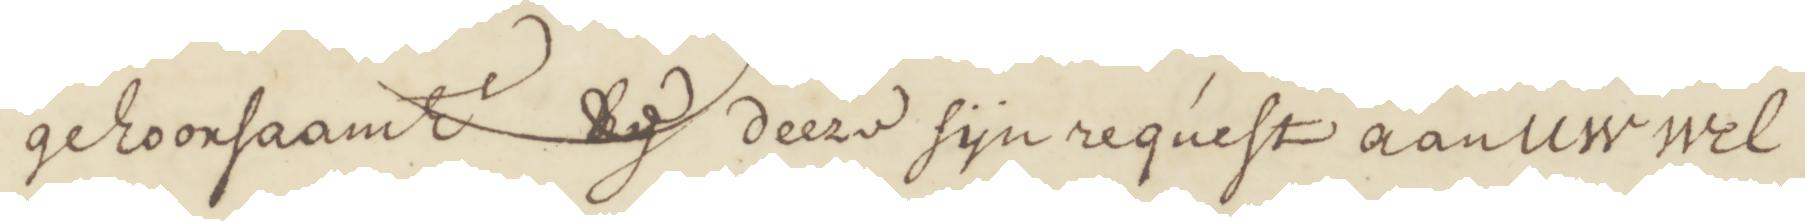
gehoorsaamht by deeze sijn request aan uw wel
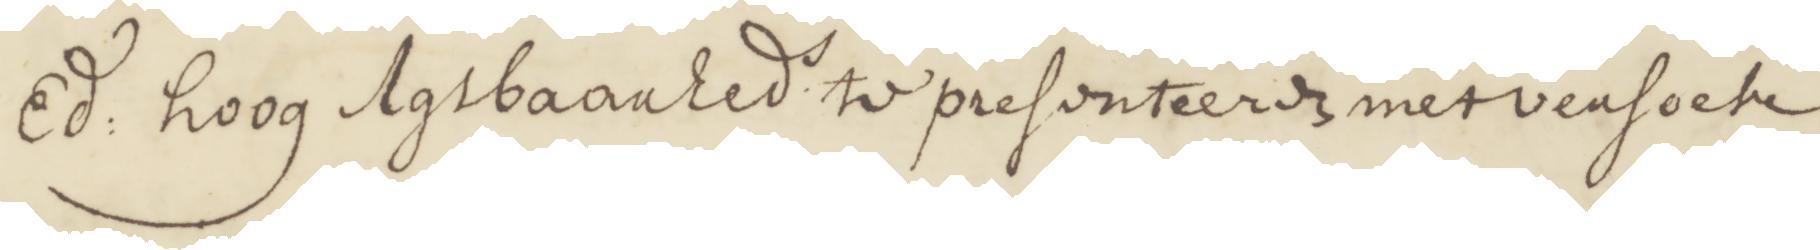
Ed: hoog Agtbaarhed.s te presenteeren met versoek
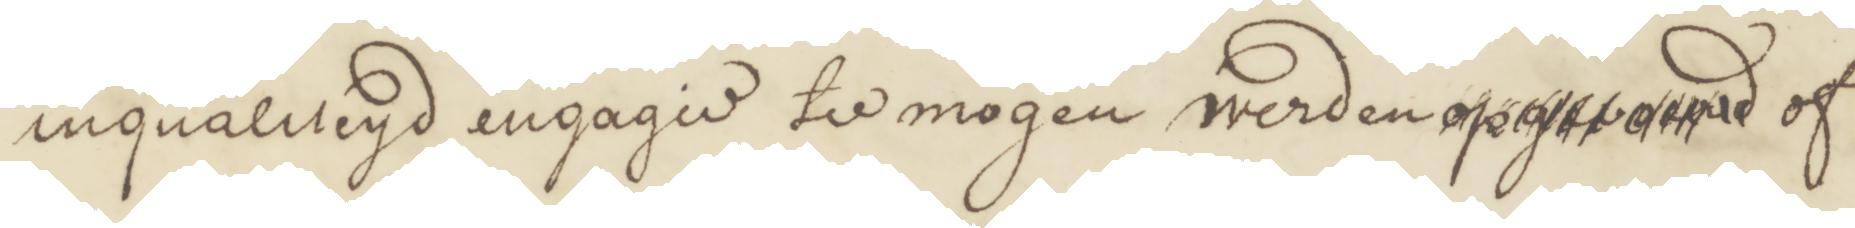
inqualiteyd en gagie te mogen werden opgevoerd of
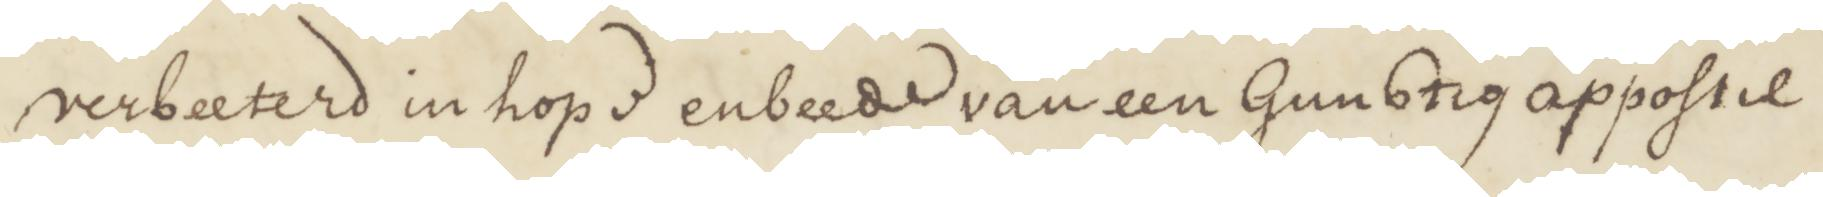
verbeeterd in hope en beede van een Gunstig appostil
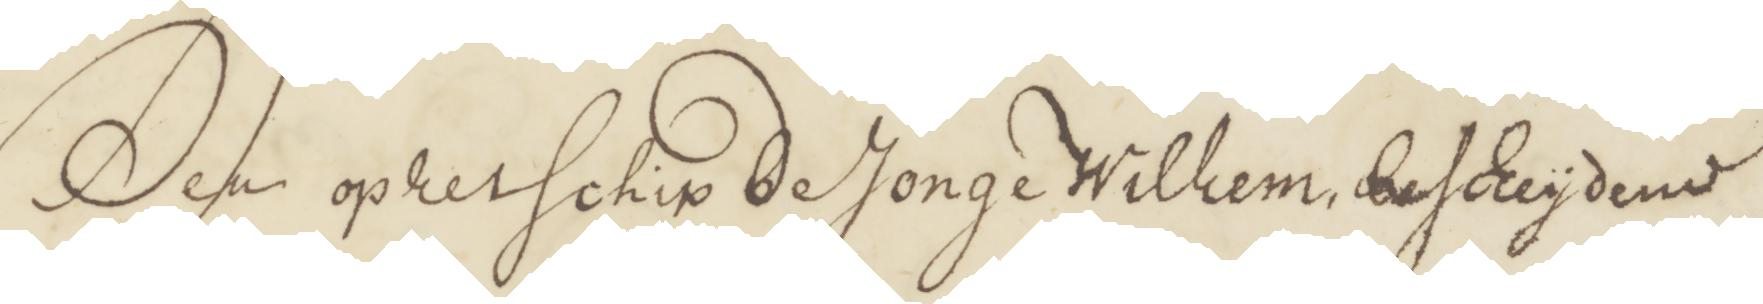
Den op het schip de Jonge Wilhem, bescheijdene
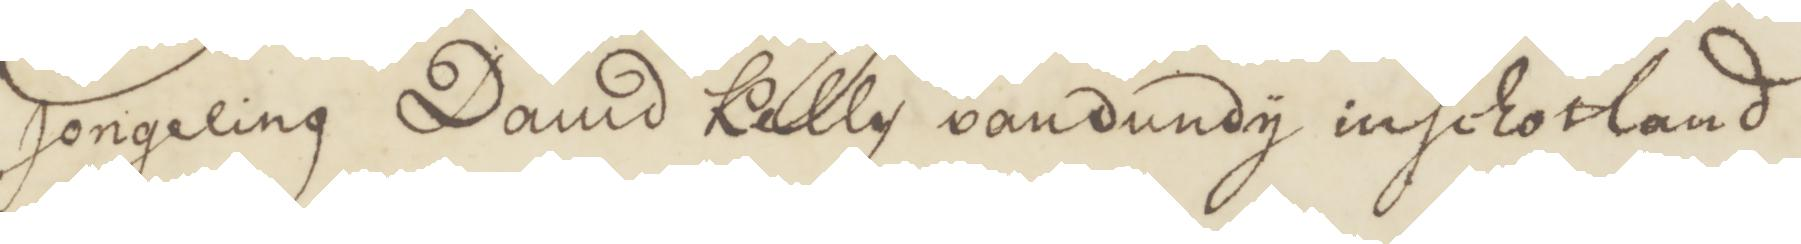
jongeling David kelly van dundij inschotland
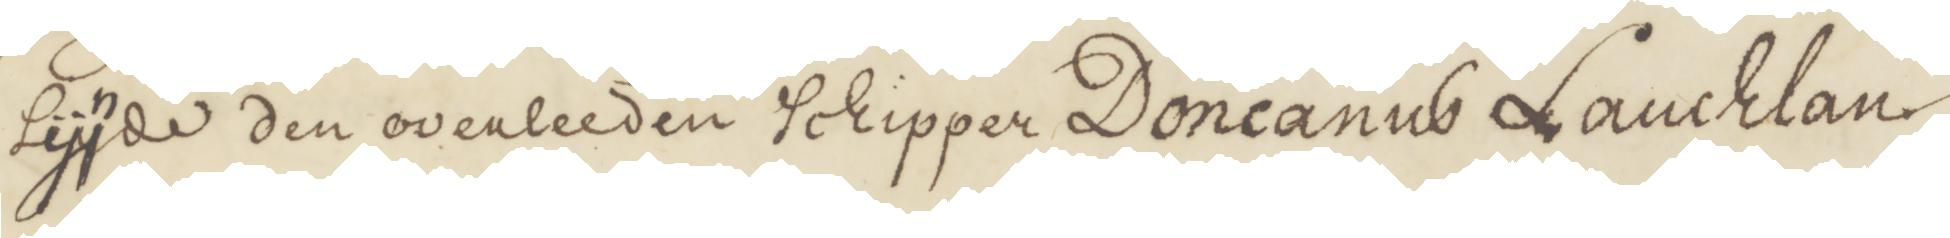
sijnde den overleeden schipper Doncanus Lauchlan
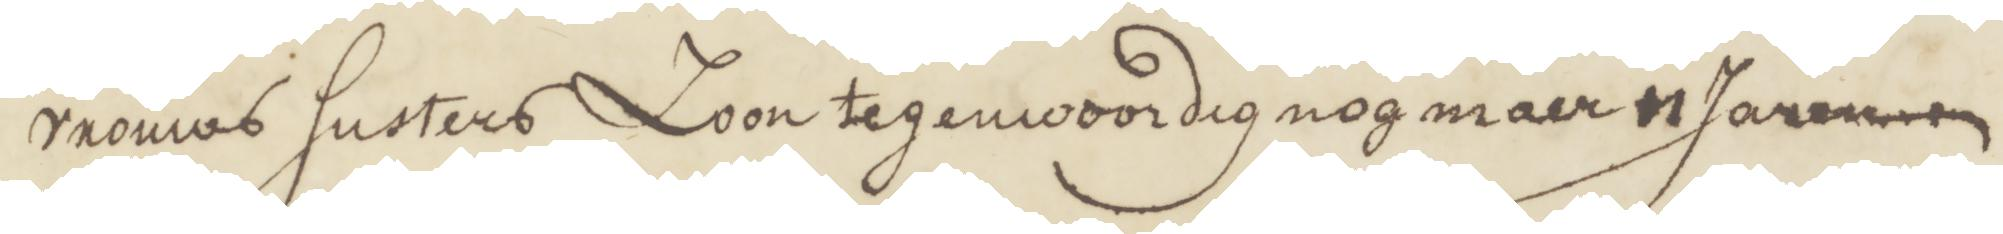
vrouws susters zoon tegenwoordig nog maer 11 Jaren
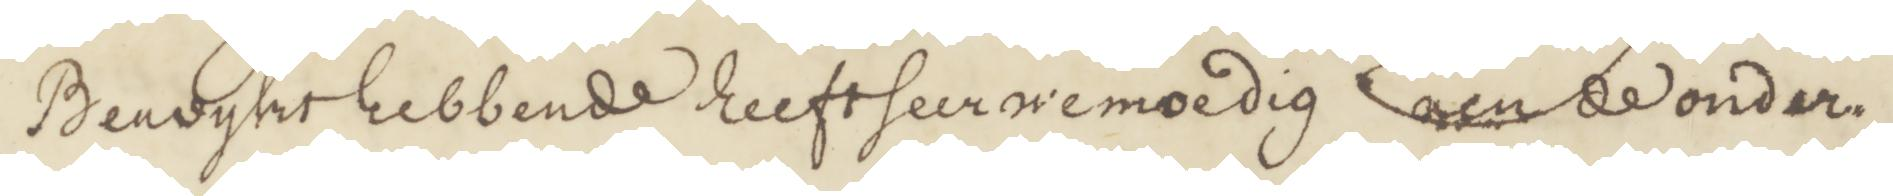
Bereykt hebbende heeft seer wemoedig aan de onder„
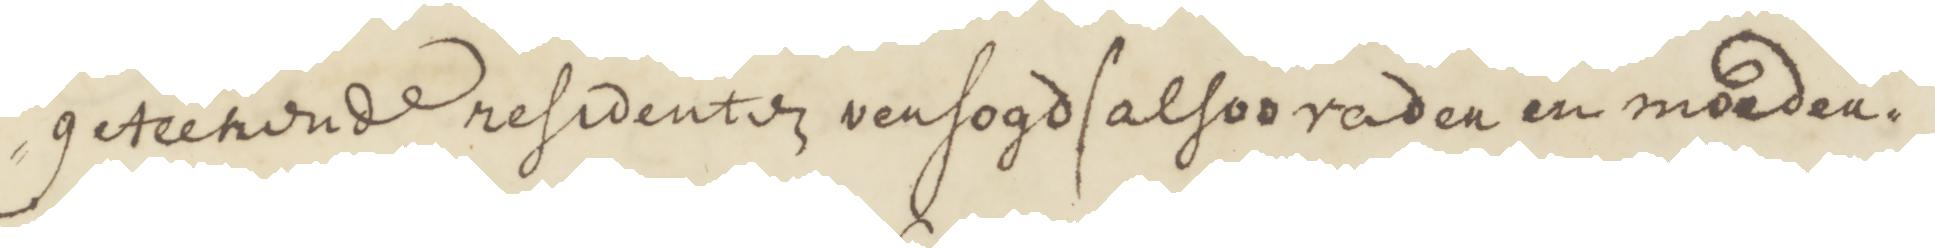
„geteekende residenten versogd / alsoo vader en moeder„
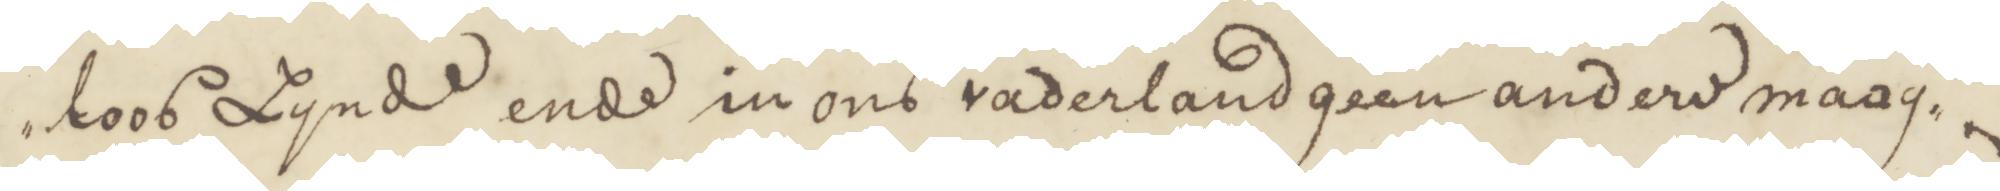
„loos zynde ende in ons vaderland geen andere maag„
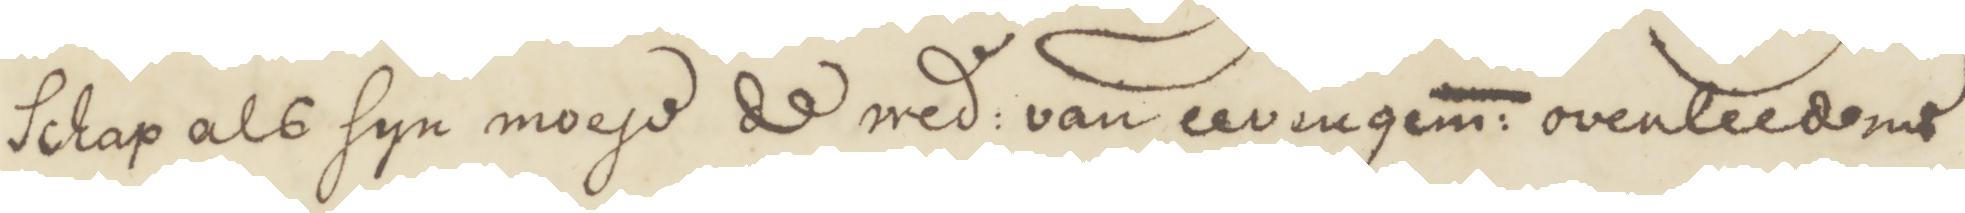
schap als syn moeje de wed:e van eevengem: overleedens
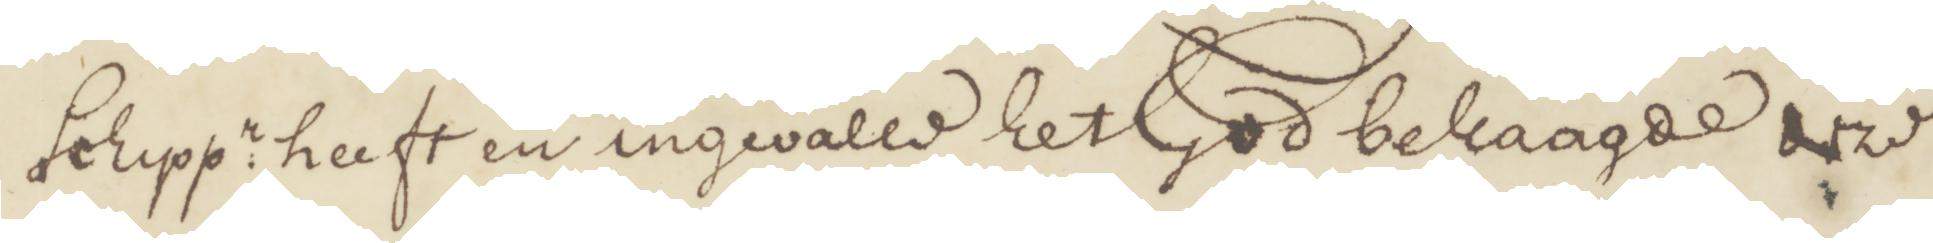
schipp:r heeft en ingevalle het God behaagde deze
